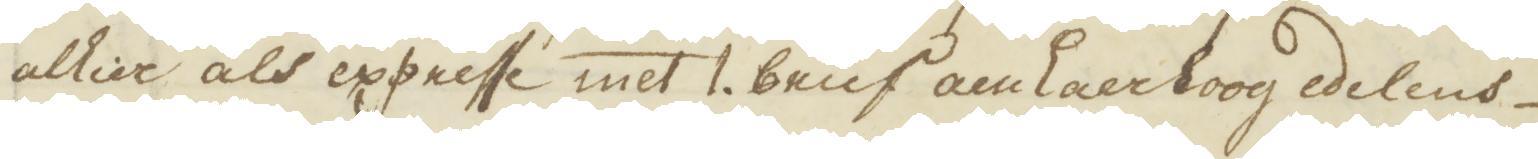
alhier als expresse met 1. brief aen haer hoog edelens —
